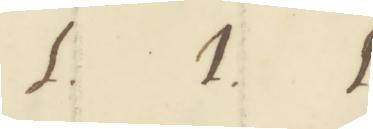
1 1 1
